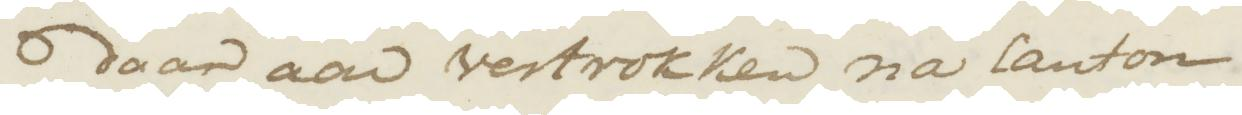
daar aan vertrokken na Canton
